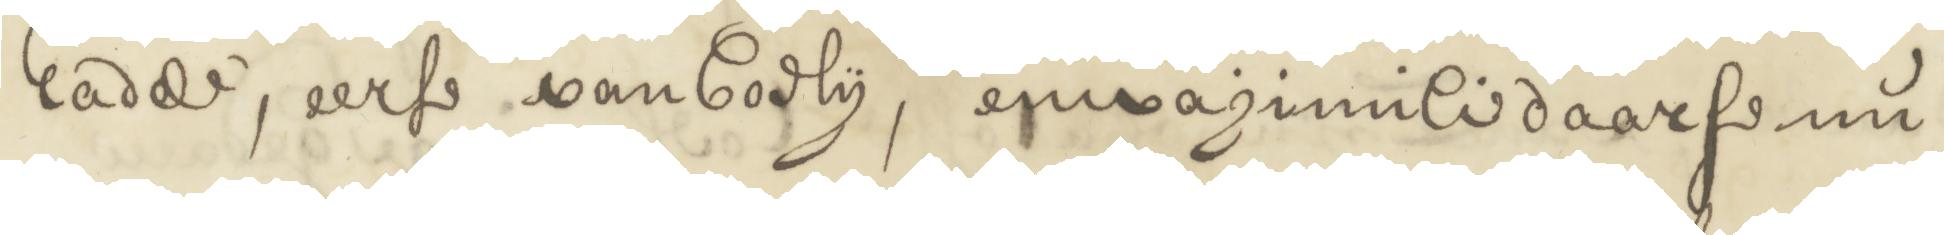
hadde, eerse van boelij, enwajimilie daarse nu
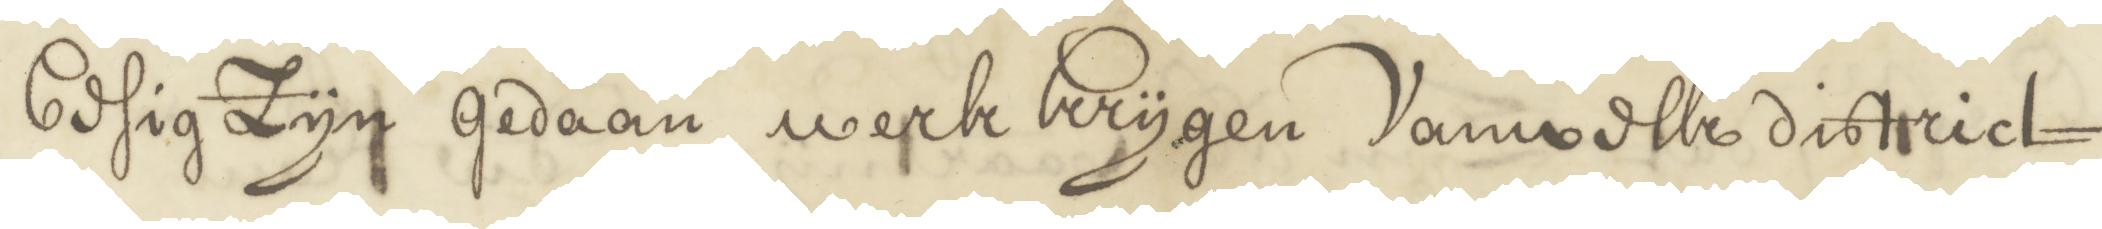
besig zijn gedaan werk krijgen Vanwelk district
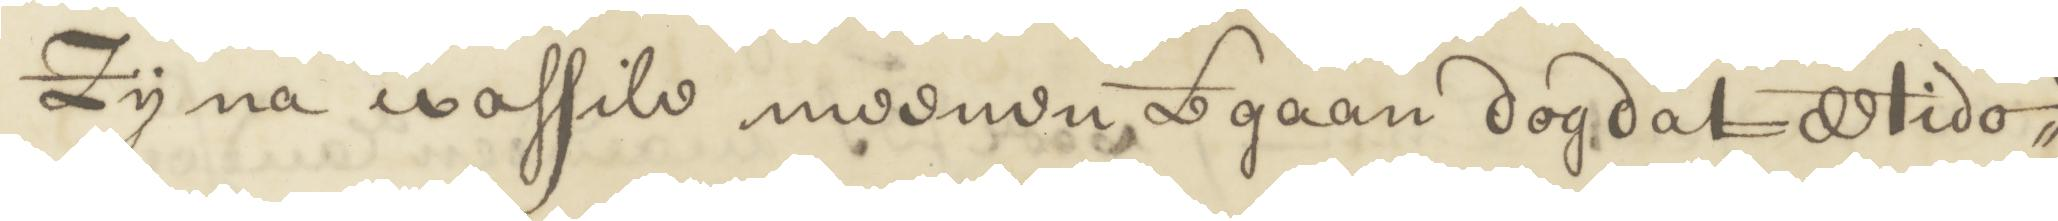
zij na wassile meenen te gaan dog dat de tido„
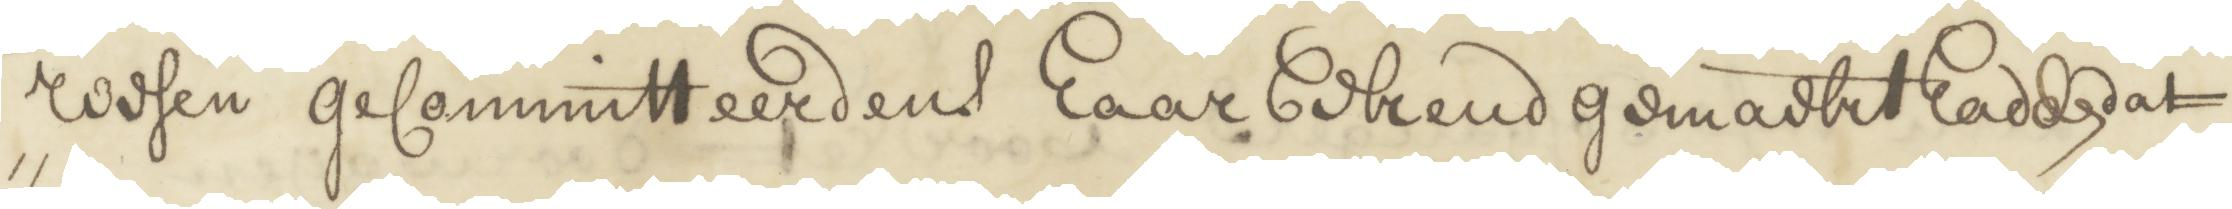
„reesen gecommitteerdens haar bekend gemaekt hadden dat
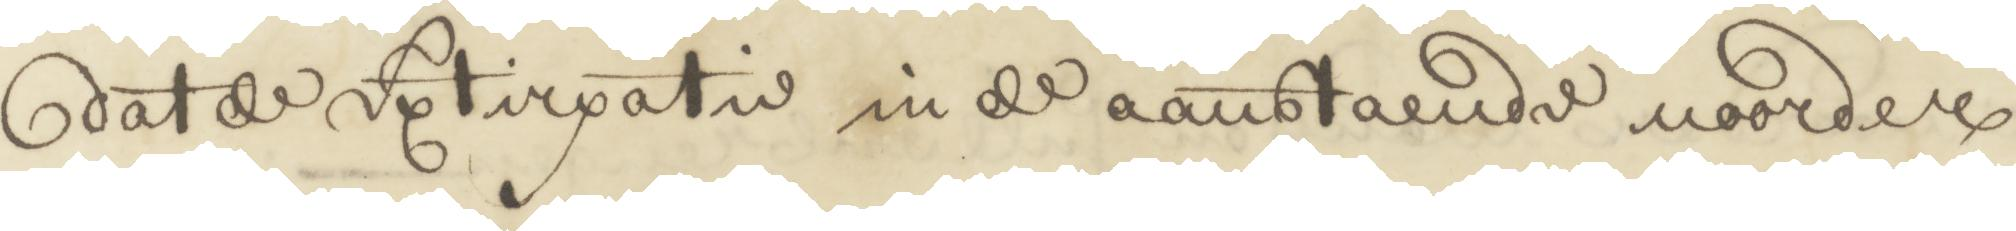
dat de Extirpatie in de aanstaende noorder
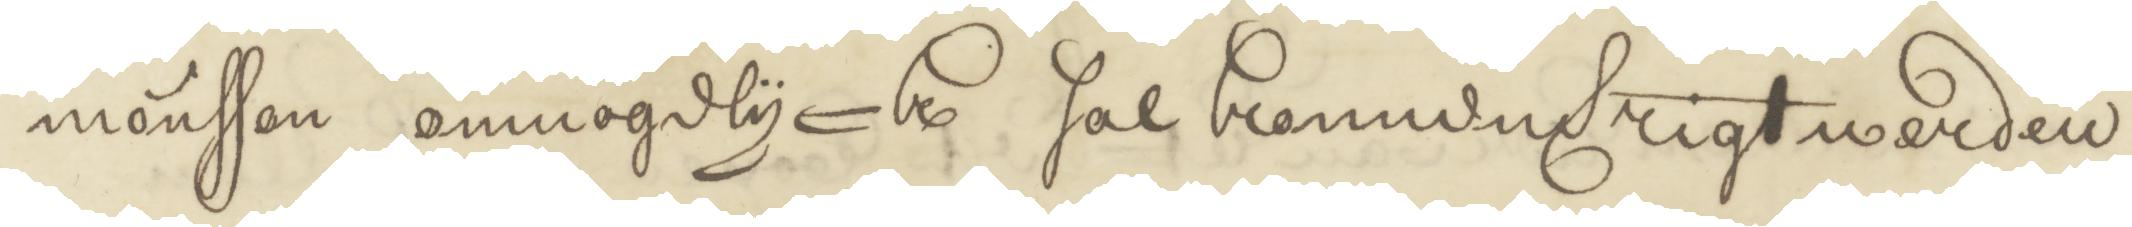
mousson onmogelijck sal konnen verrigt werden
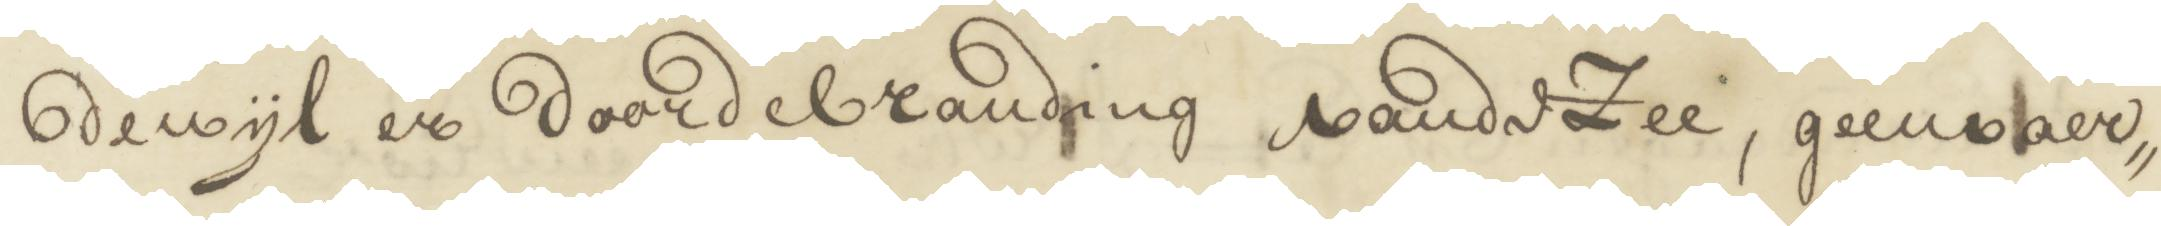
dewijl ër door debranding van de zee, geen vaer„
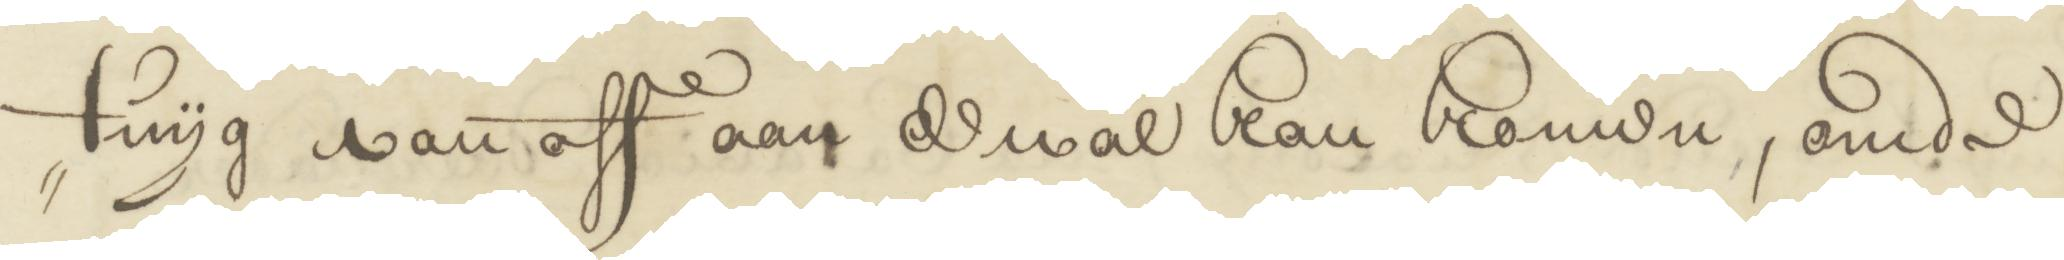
„tuijg van off aan de wal kan komen, omde
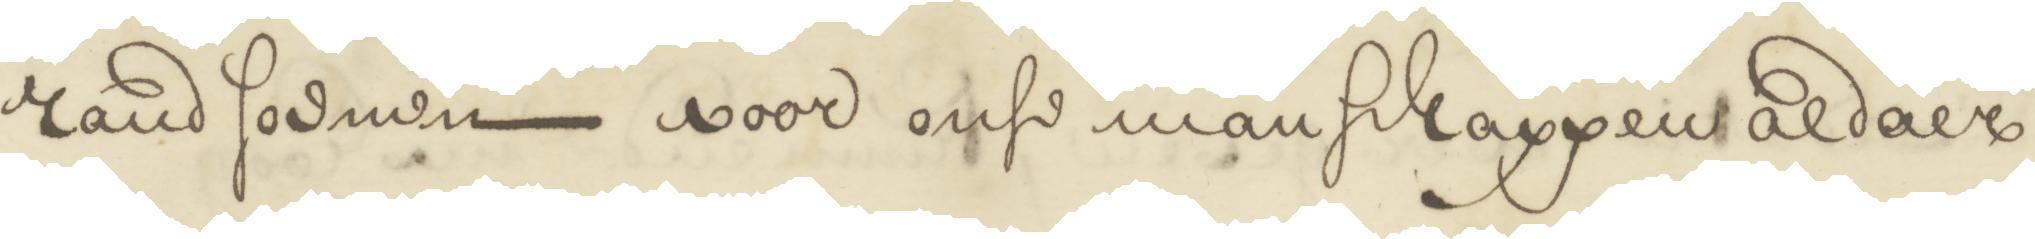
rand soenen voor onse manschappen aldaer
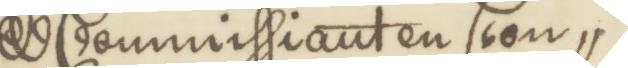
de Commissianten Con„
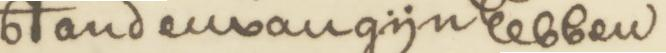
standenvangijn hebben
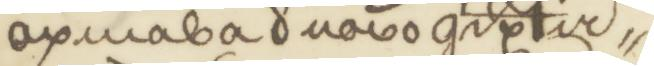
opmaba d' novo g'Extir„
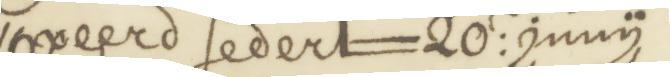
peerd sedert 20: junij
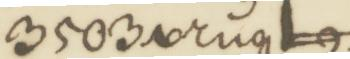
3503 vrugt
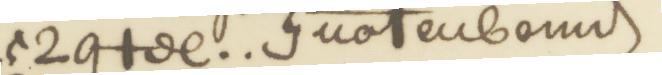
529 tel.. } notenbomen
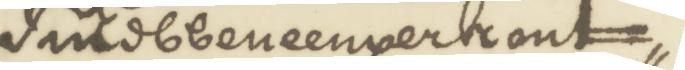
Enhebben eenperk ont„
